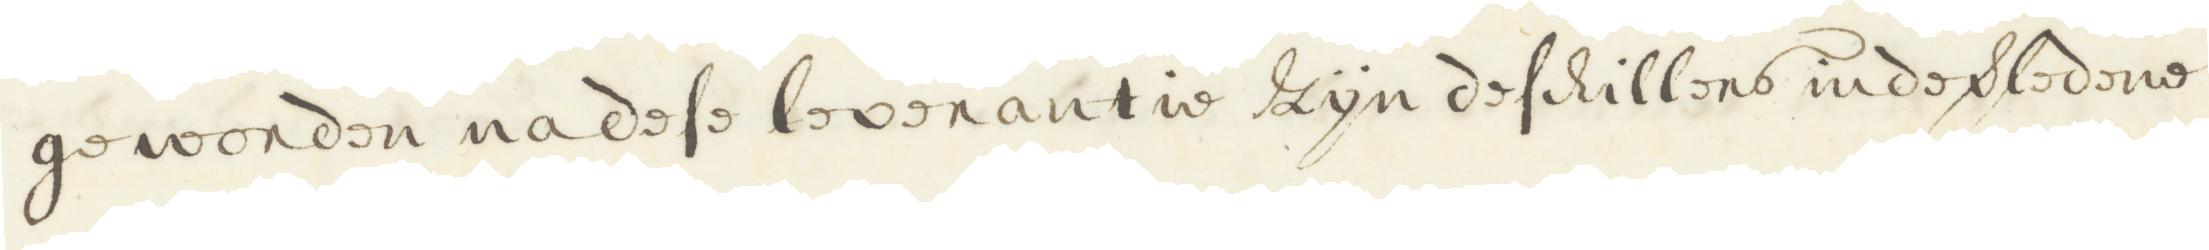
geworden nadese leverantie zijn de schillers in deverledene
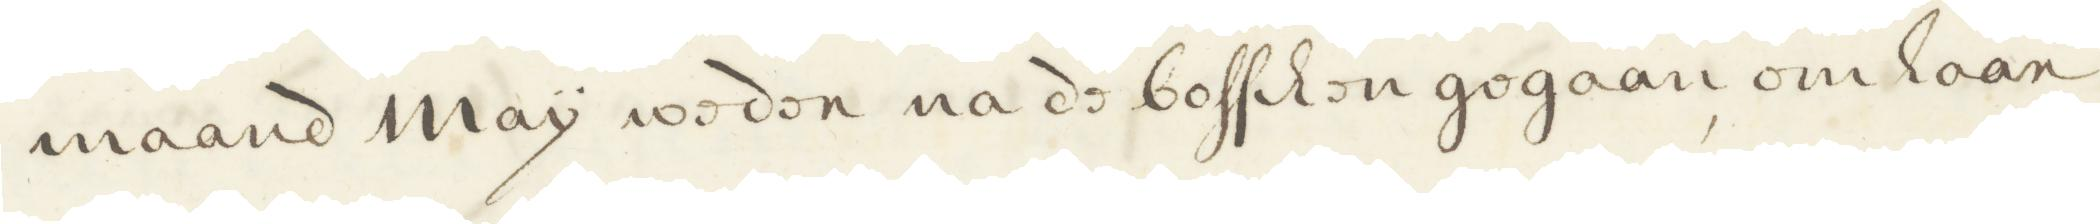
maand Maij weder na de bosschen gegaan, om haar
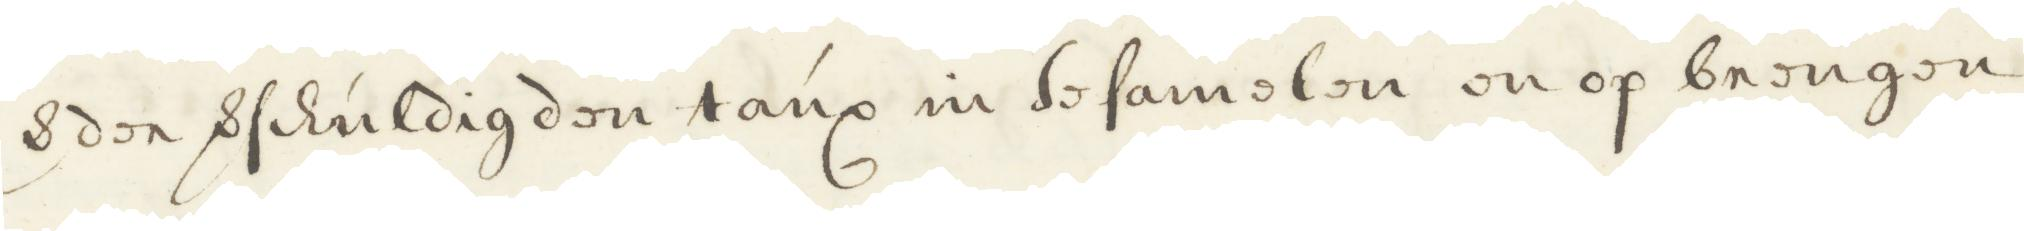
verder verschuldigden taux in te samelen en op brengen
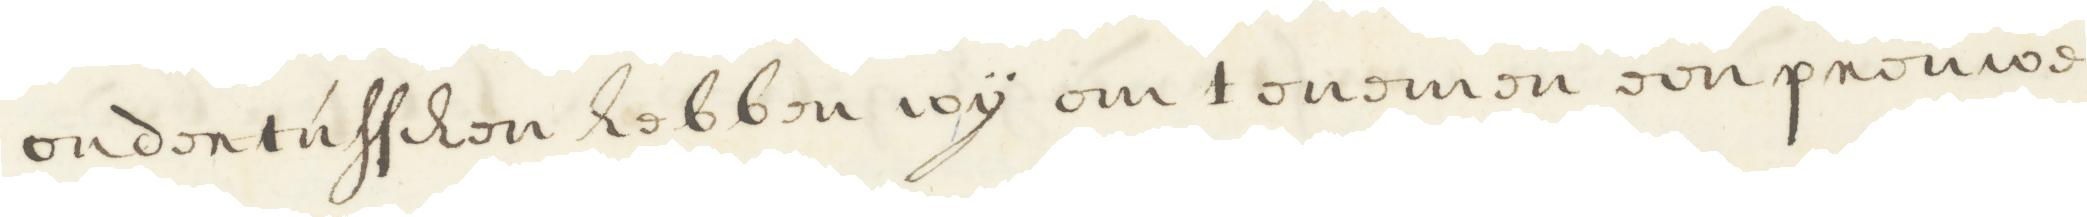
ondertusschen hebben wij om tenemen een preuwe
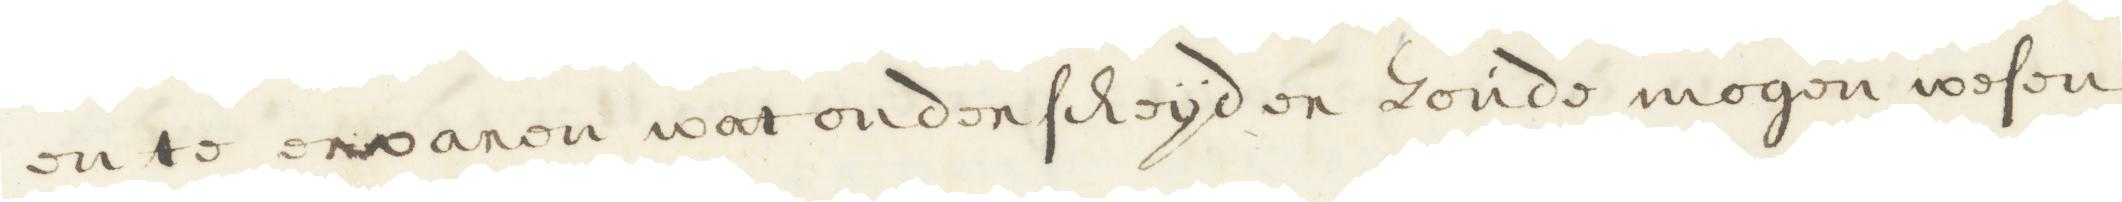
en te ervaren wat onderscheijder zoude mogen wesen
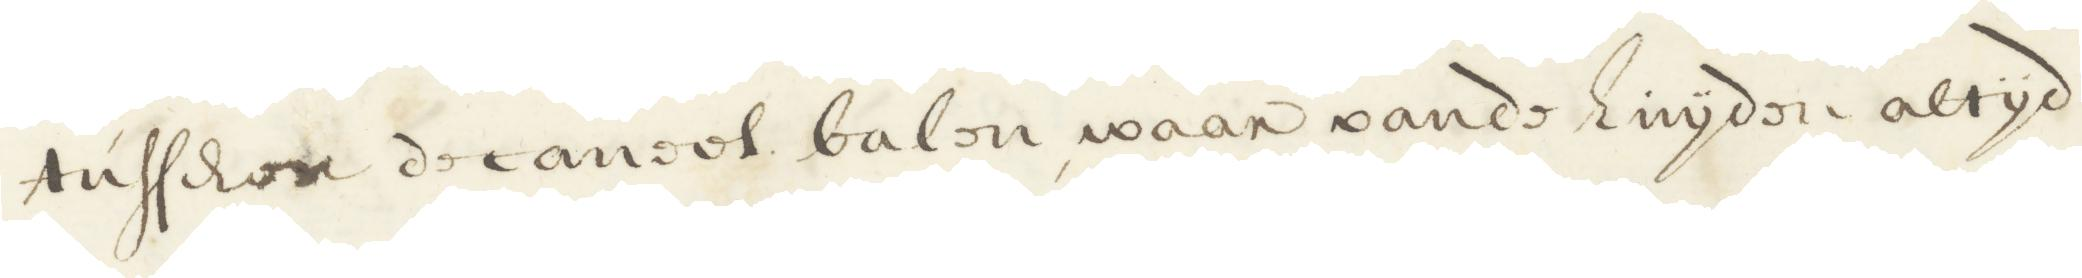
tusschen de caneel balen, waar vande huijden altijd
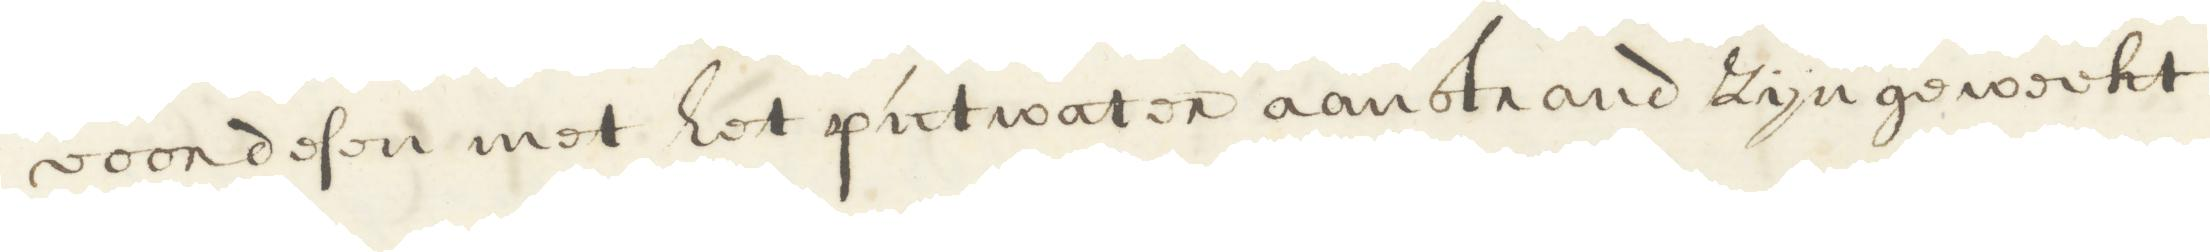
voor desen met het putwater aan strand zijn geweekt
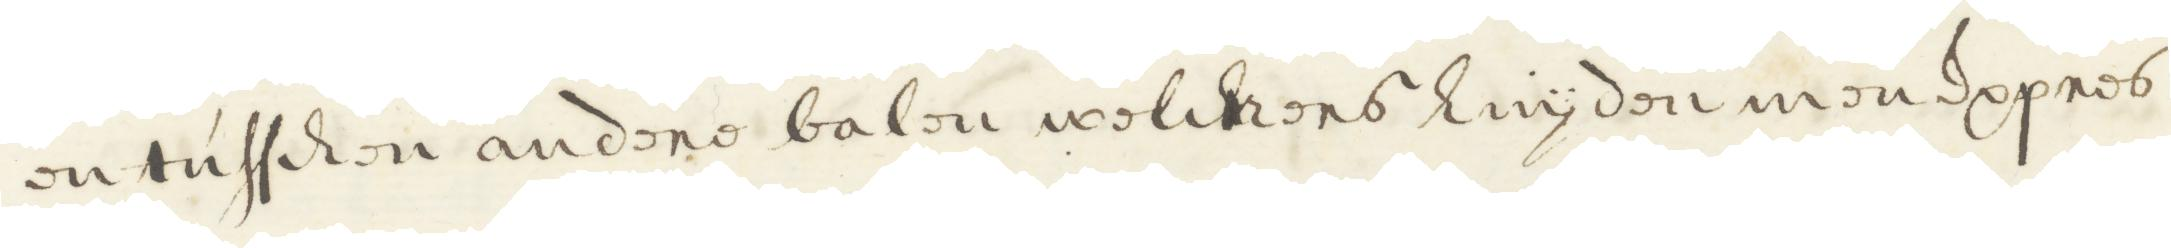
en tusschen andere balen welckers huijden men Expres
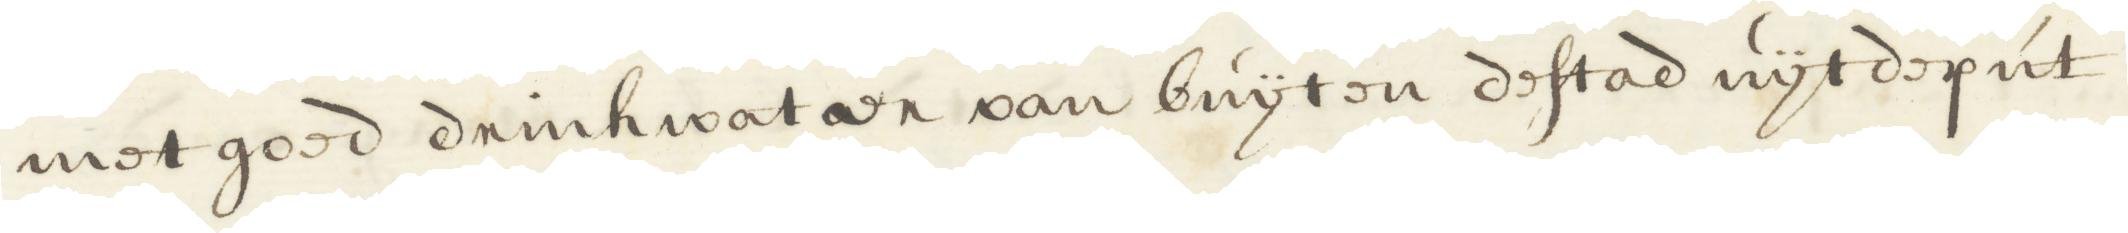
met goed drinkwater van buijten destad uijt deput
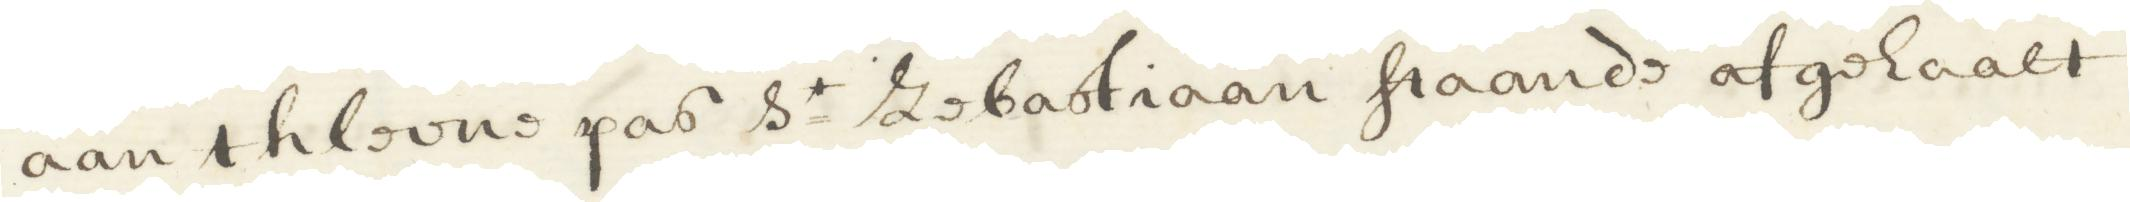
aan t kleene pas s=t zebastiaan staande afgehaalt
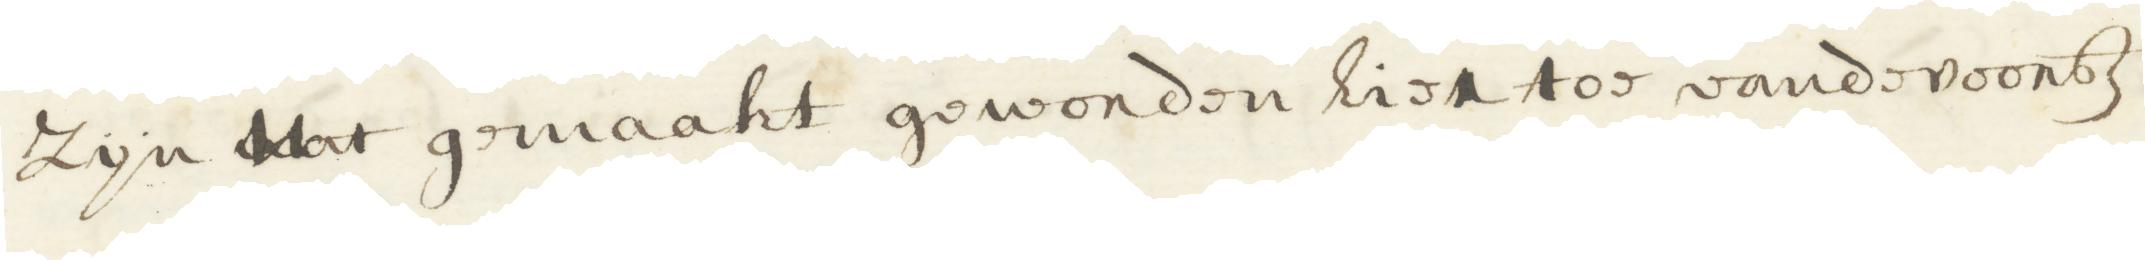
zijn wat gemaakt geworden hier toe van de voorst
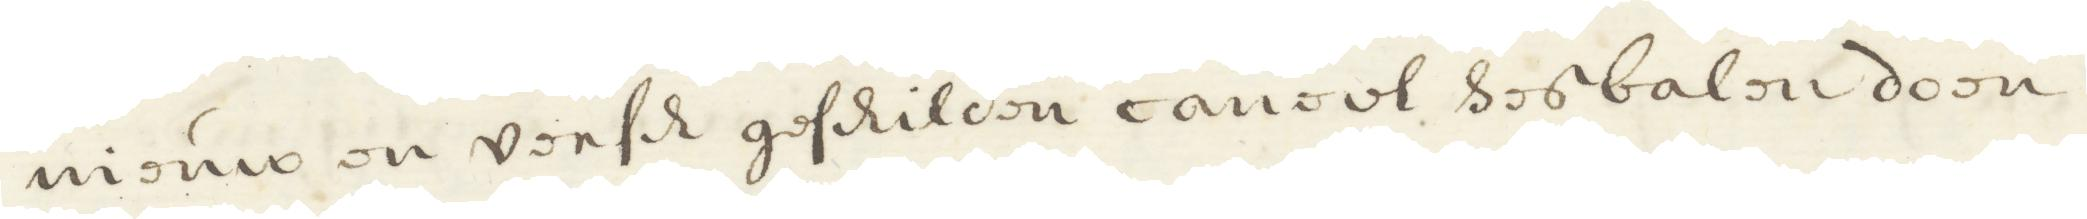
nieuw en verser geschilden caneel ses balen doen
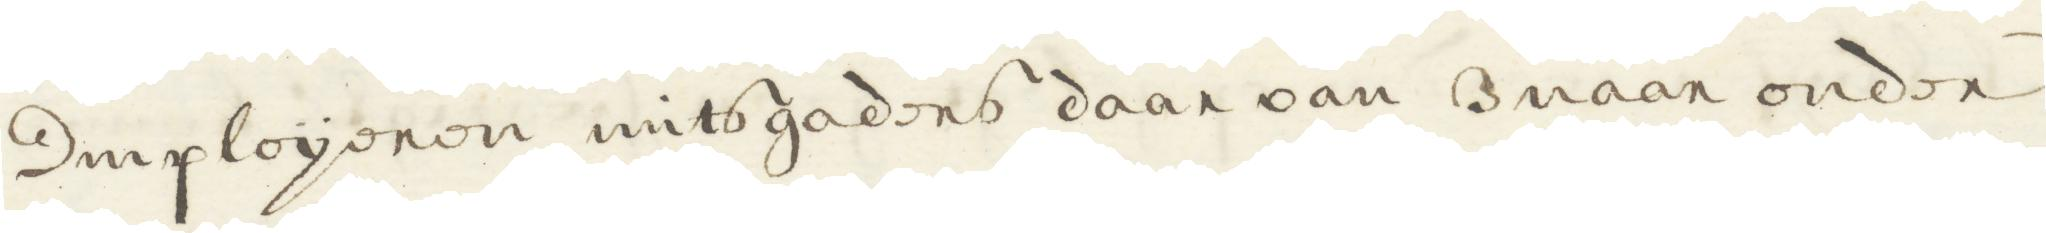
Emploijeren, mitsgaders daar van 3 naar onder
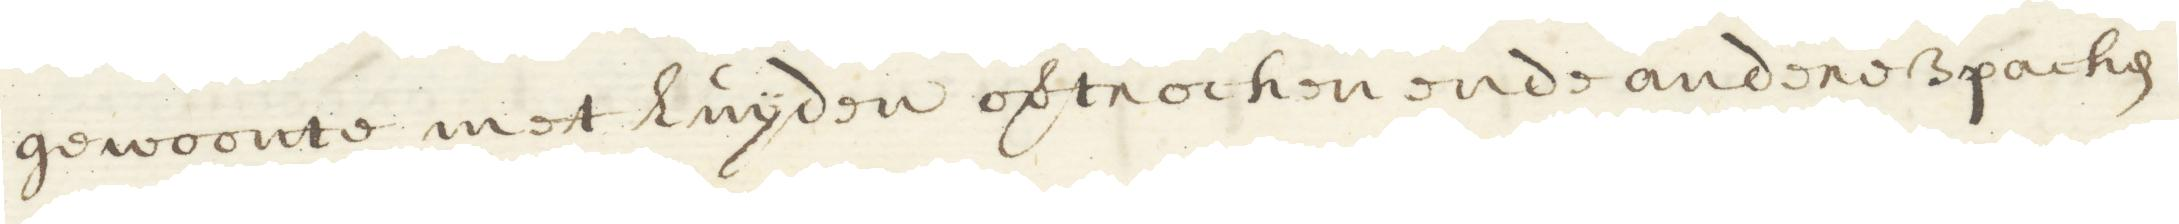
gewoonte met huijden overtrocken ende andere 3 packen
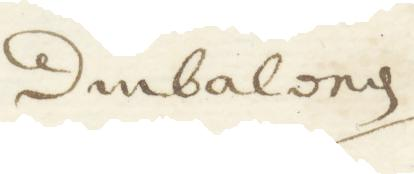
Embaleren
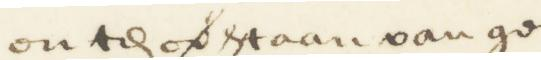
en ten overstaan van ge
